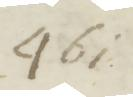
461:
